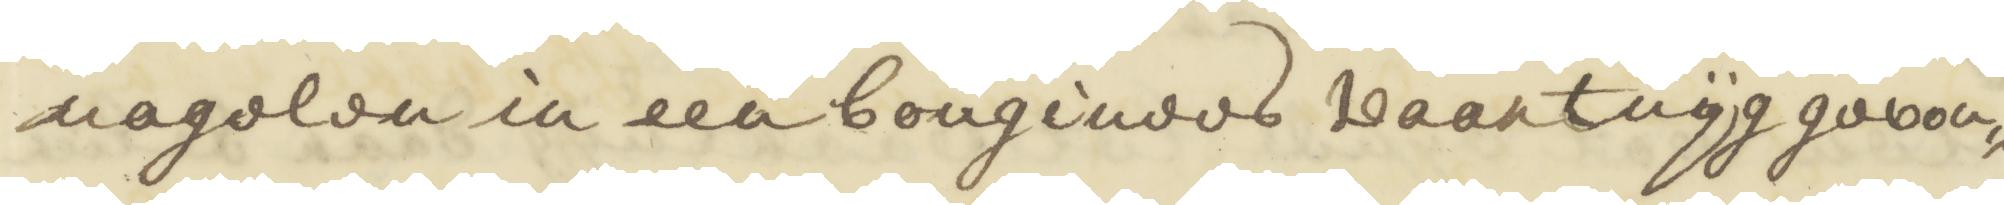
nagelen in een bouginees vaartuijg gevon„
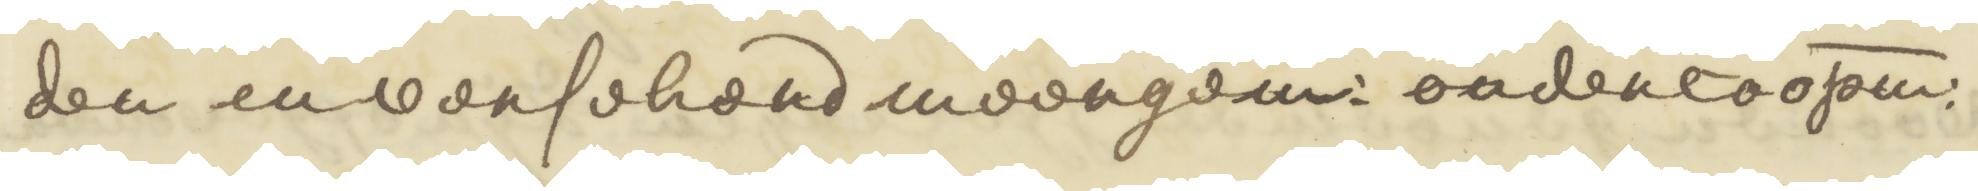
den en versekerd meergem: ondercoopm:
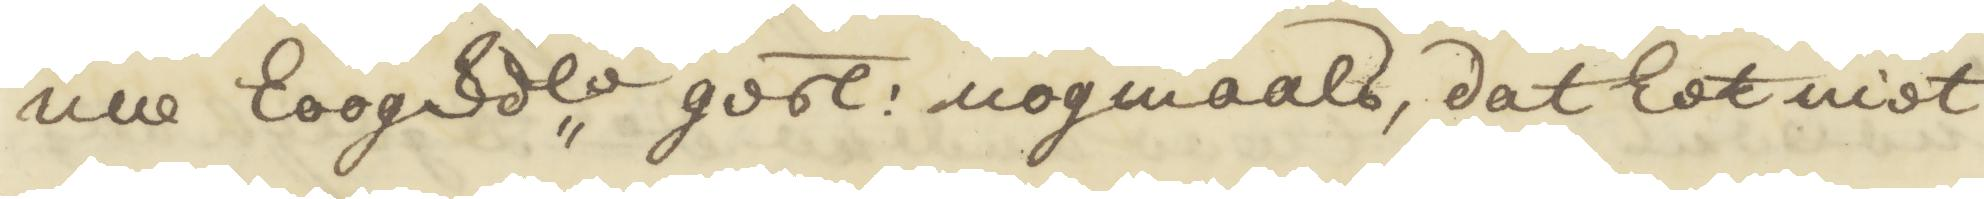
uw hoog Ed„le gest: nogmaals, dat het niet
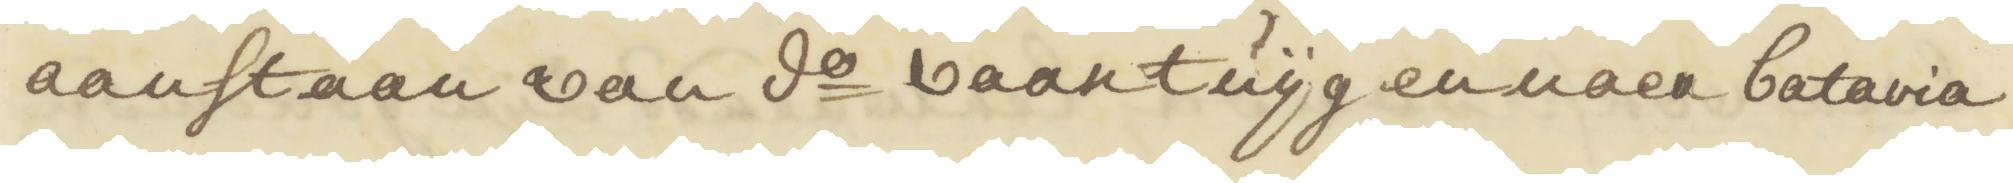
aanstaan van d=o vaartuijg en naer batavia
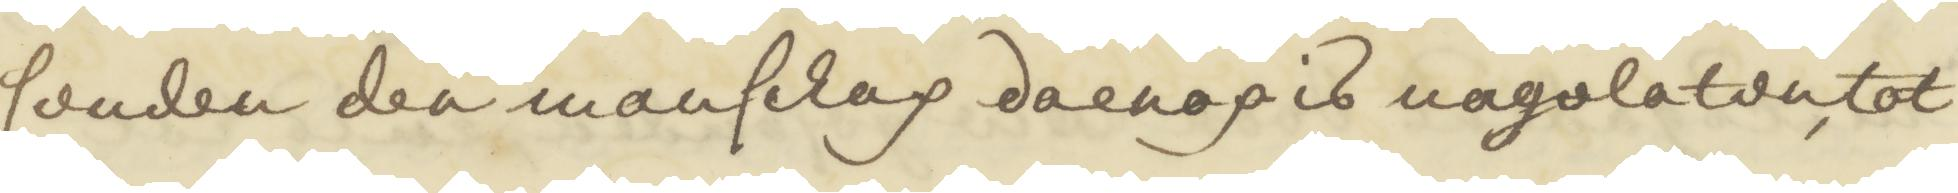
senden der manschap daerop is nagelaten, tot
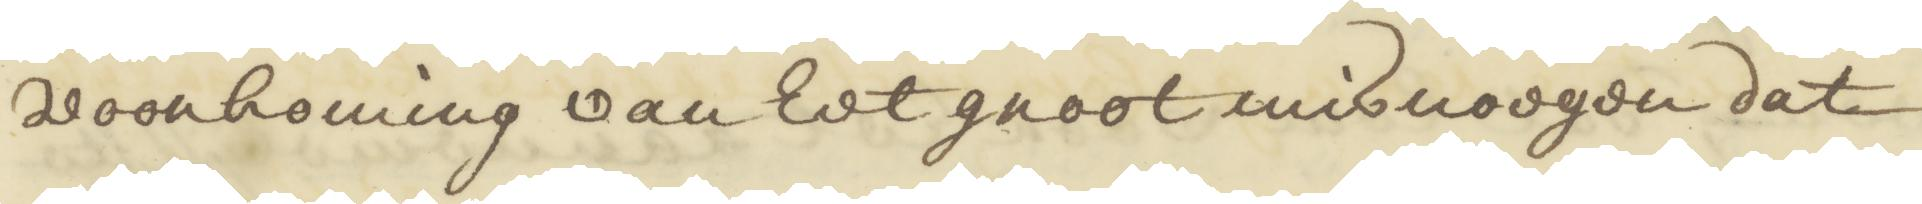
voorkoming van het groot misnoegen dat
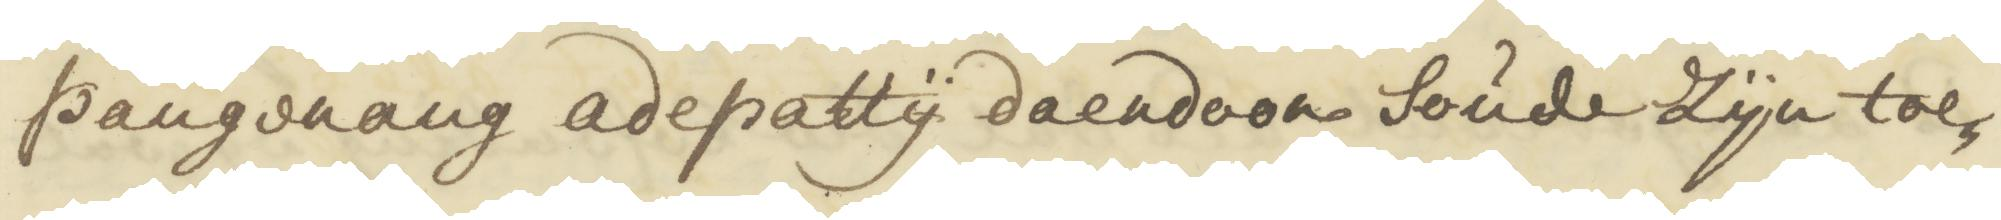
Pangerang adepattij daerdoor soude zijn toe„
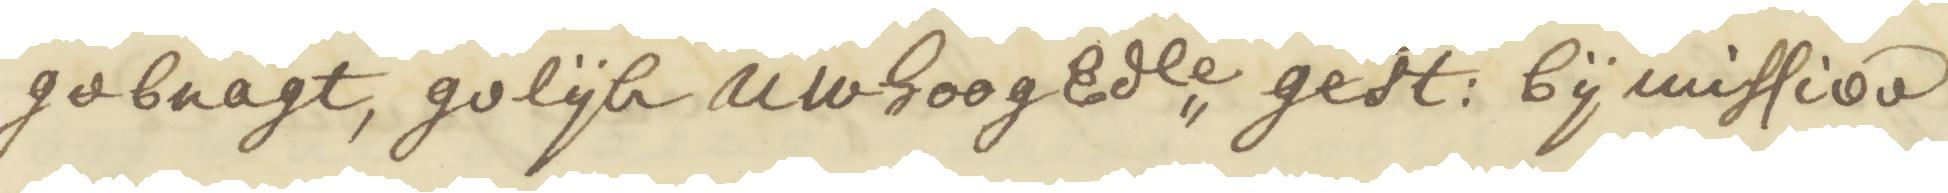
gebragt, gelijk uw hoog Ed„le gest: bij missive
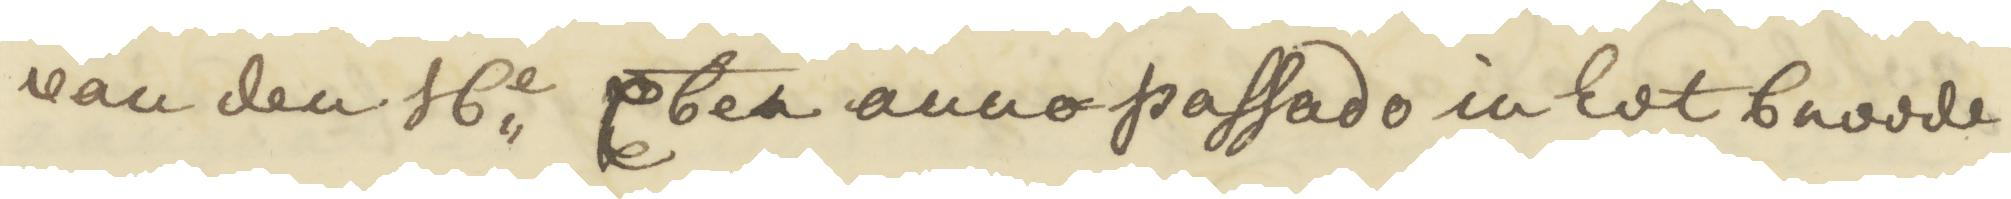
van den 16„e xber anno passado in het breede
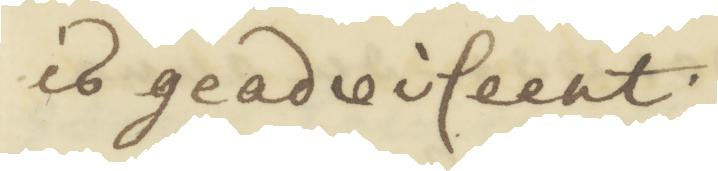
is geadviseert.
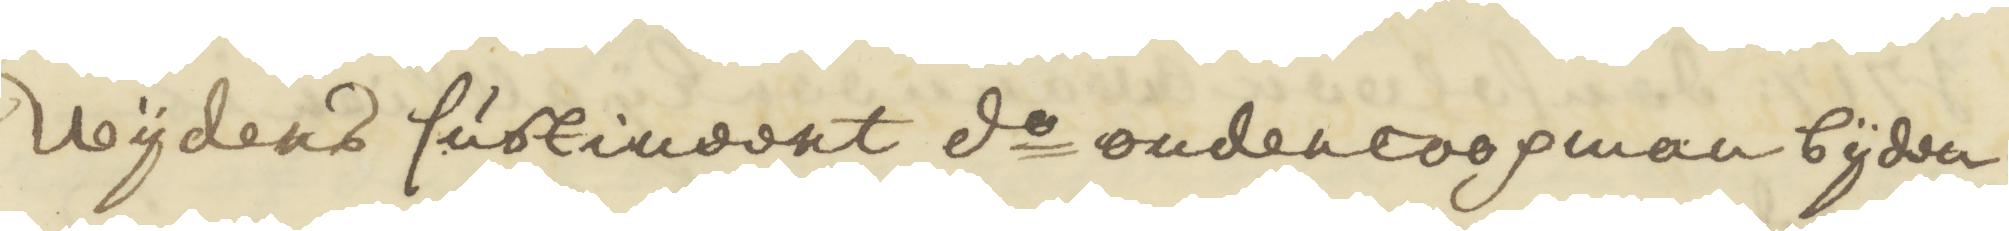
wijders sustineert d=o ondercoopman bijden
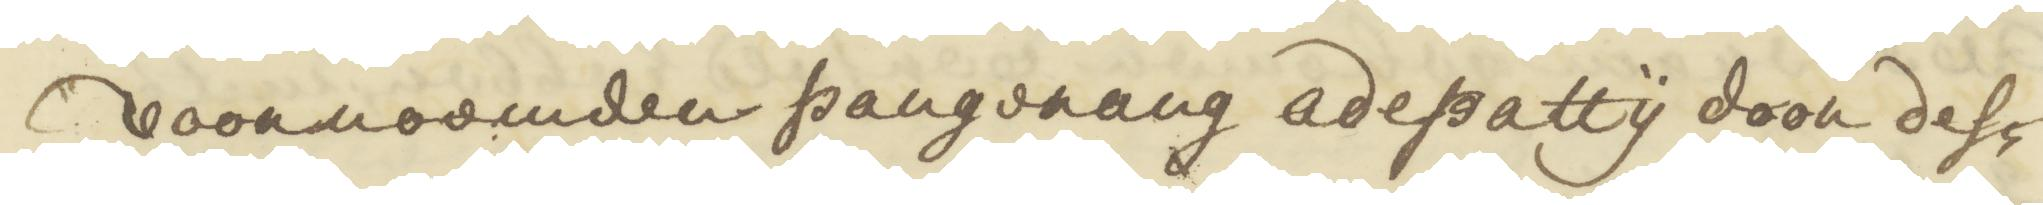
voornoemden pangerang adepattij door des
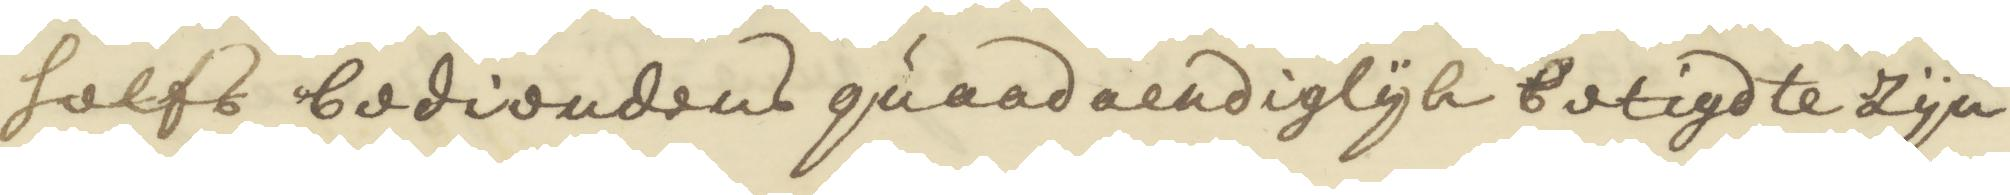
selfs bediendens quaadaerdiglijk betigd te zijn
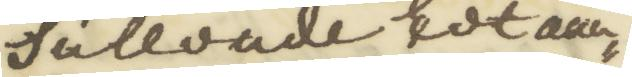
sullende het aan„
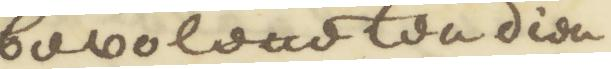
bevolene ten dien
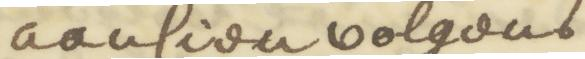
aansien volgens
